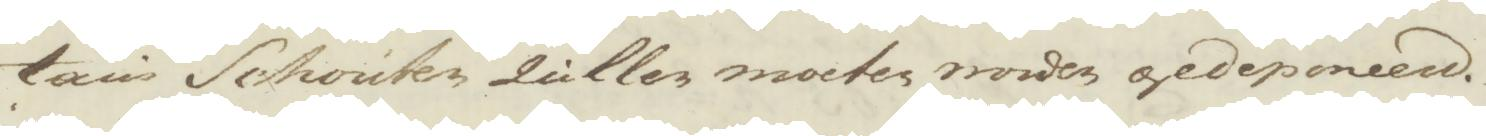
taris Schouten zullen moeten worden gedeponeerd.
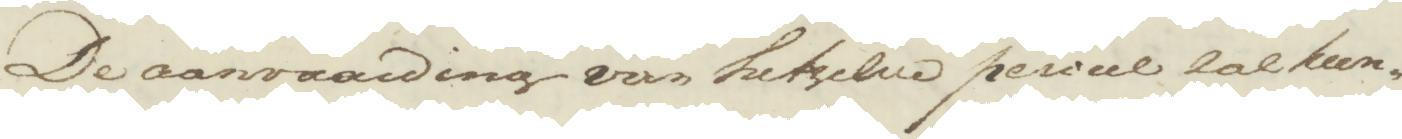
De aanvaarding van hetzelve perceel zal kun„
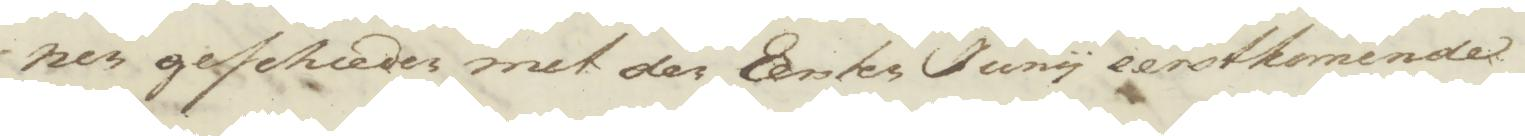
nen geschieden met der Eersten Junij eerstkomende
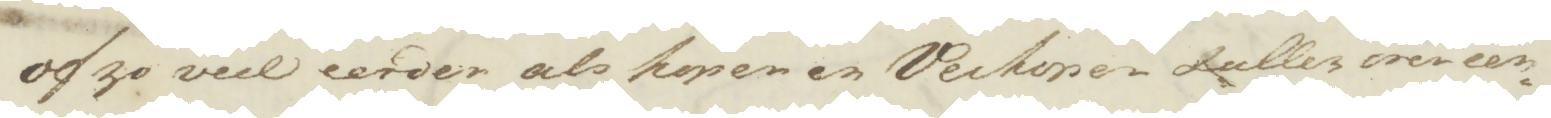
of zo veel eerder als koper en Verkoper zullen over een„
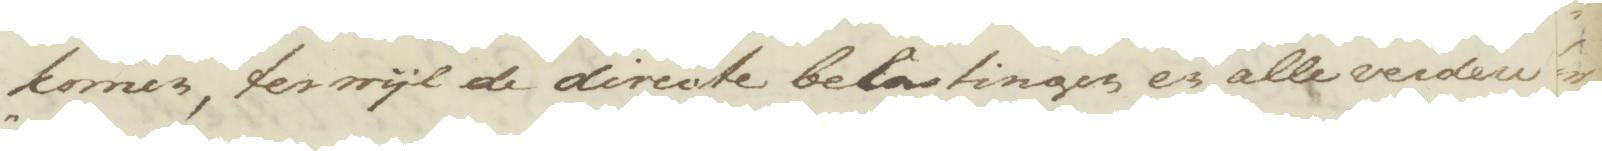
„komen, terwijl de directe belastingen en alle verdere
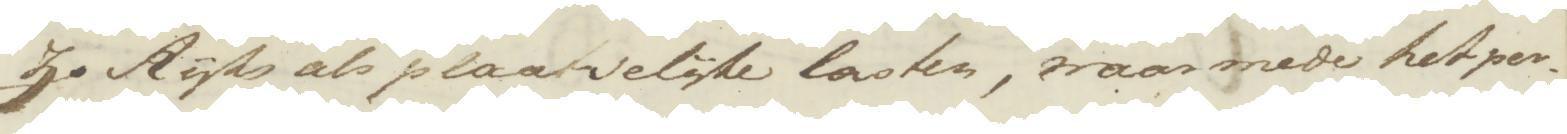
zo Rijks als plaatselijke lasten, waarmede het per„
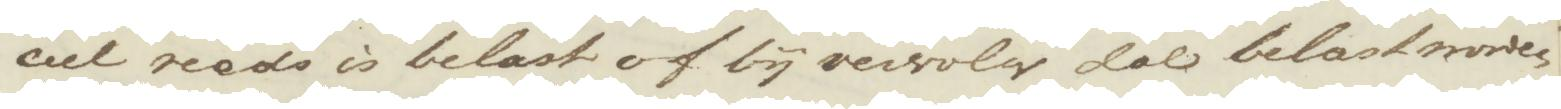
ceel reeds is belast of bij vervolg zal belast worden
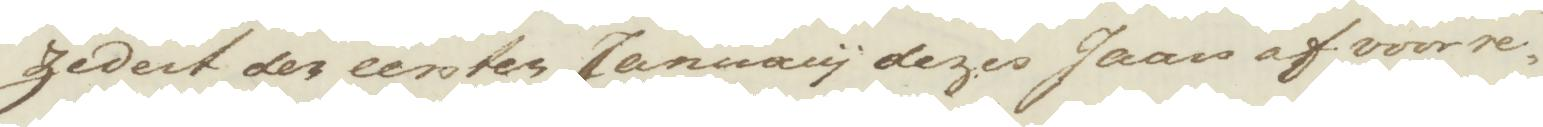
zedert der eersten Januarij dezes Jaars af voor re„
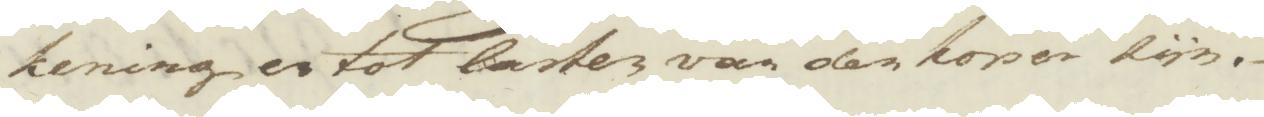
kening en tot lasten van den koper zijn.
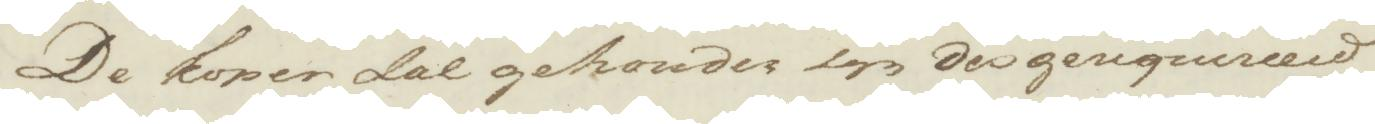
De koper zal gehouden zyn des gerequireerd
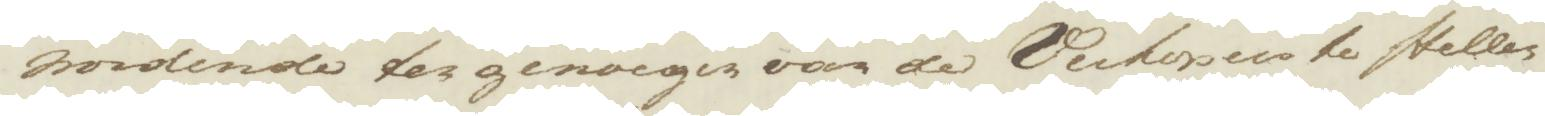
wordende ten genoegen van de Verkoper te stellen
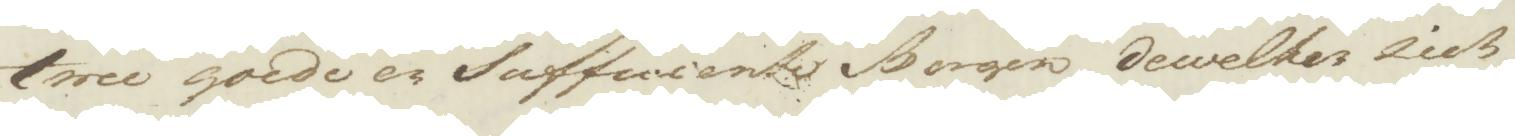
twee goede en sufficiente Borgen, dewelken zich
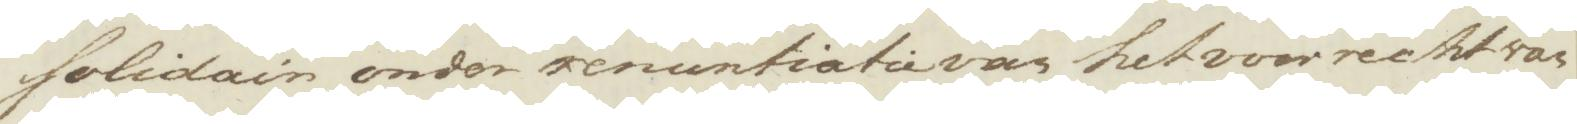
solidair onder renuntiatie van het voorrecht van
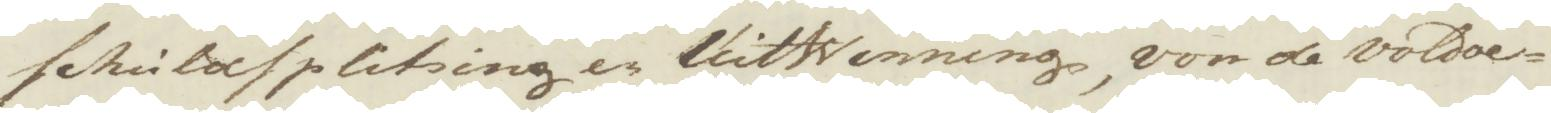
schuldsplitsing en uitwenning, voor de voldoe„
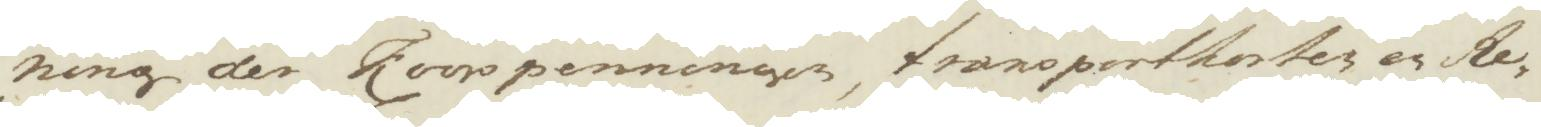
„ning der Koop penningen, transportkosten en Re„
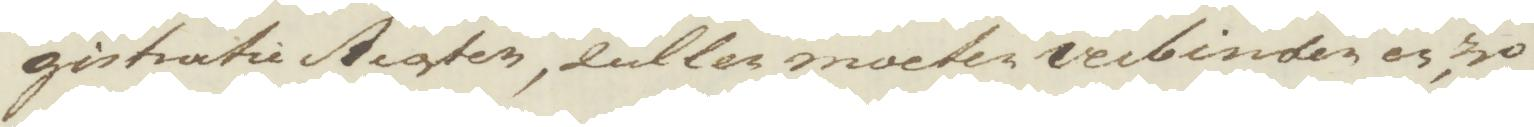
gistratie Regten, zullen moeten verbinden en, zo
